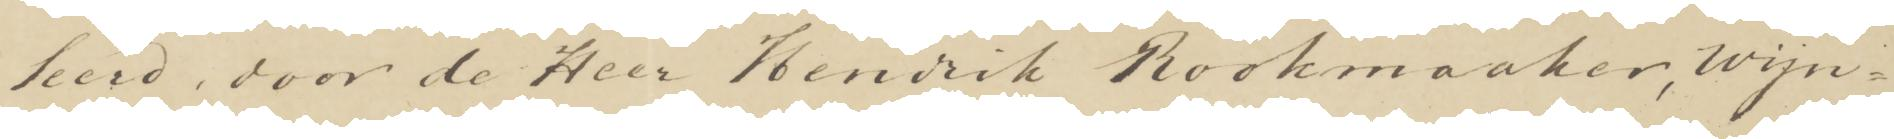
seerd, door de Heer Hendrik Rookmaaker, wijn=
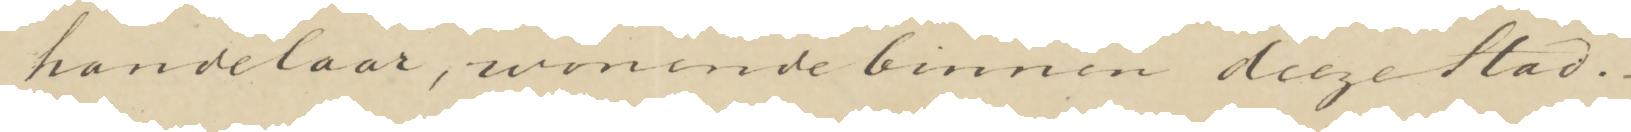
handelaar, wonende binnen deeze stad.
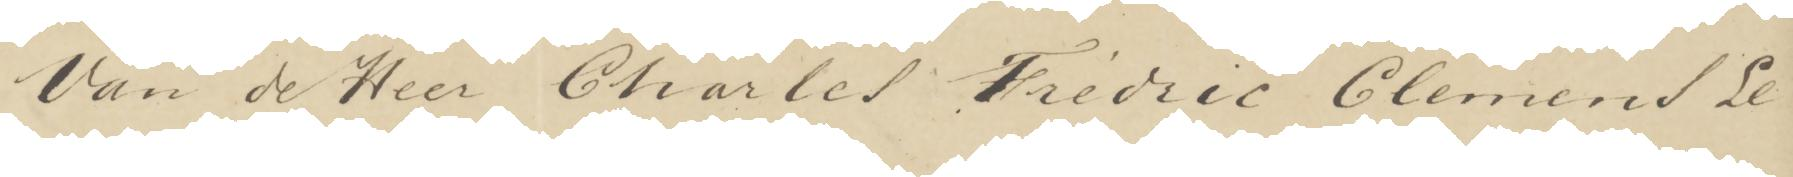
Van de Heer Charles Fredric Clemens Le
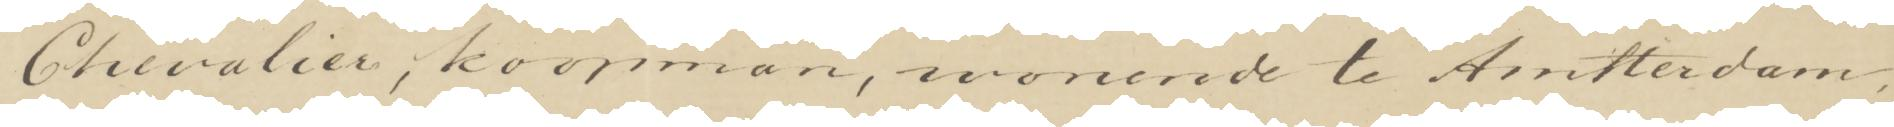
Chevalier, koopman, wonende te Amsterdam,
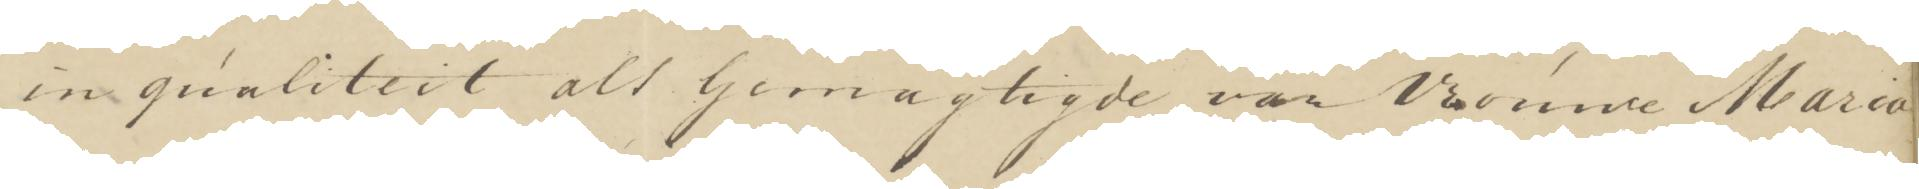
in qualiteit als Gemagtigde van Vrouwe Maria
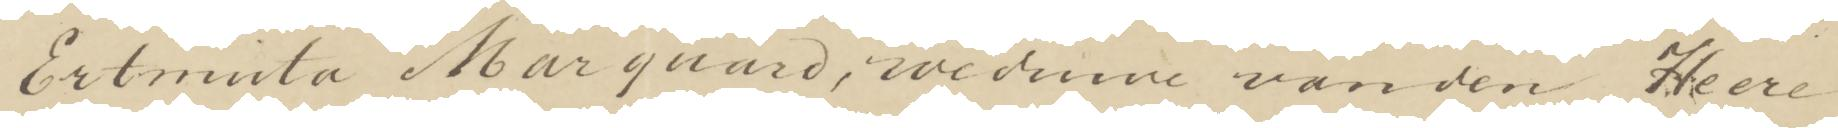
Ertmuta Marquard, weduwe van den Heere
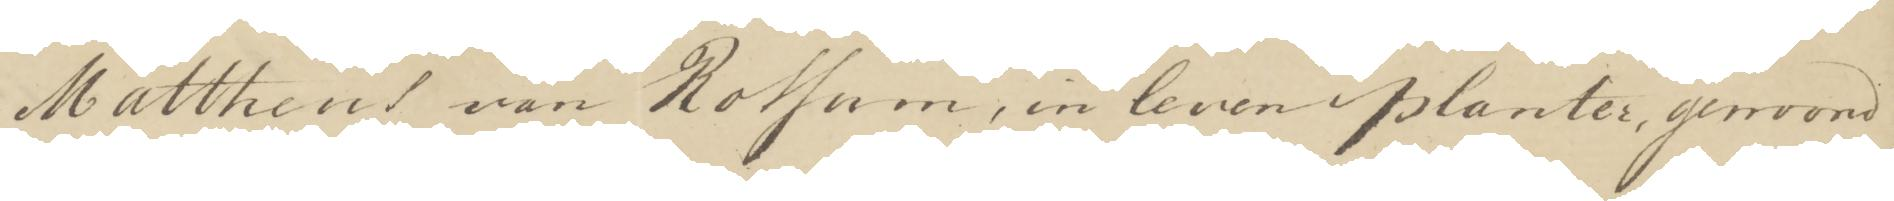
Mattheus van Rossum, in leven Planter, gewoond
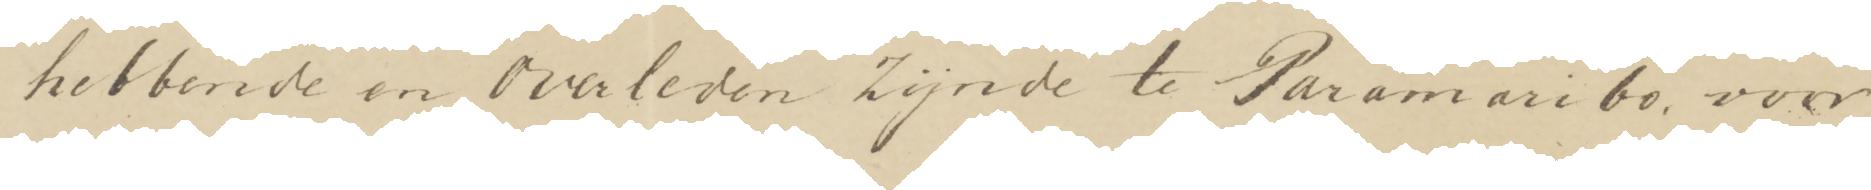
hebbende en overleden zijnde te Paramaribo, voor
